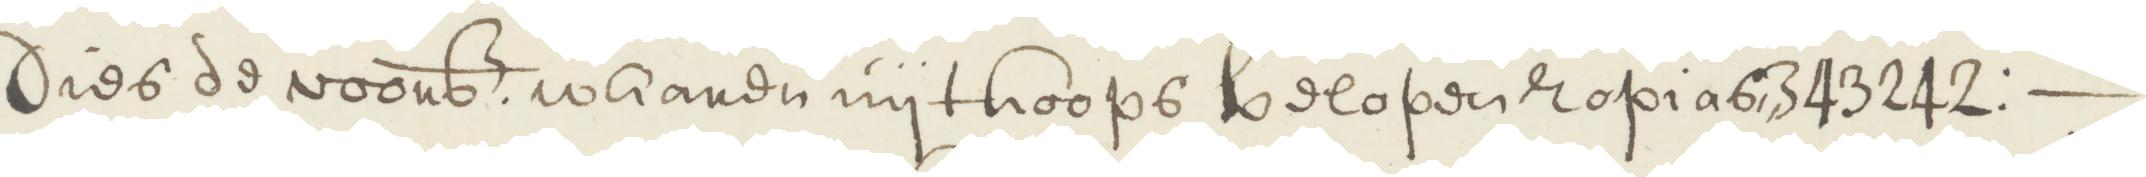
dies de voorsz: wharen uijtkoops belopen ropias „ 343242: —
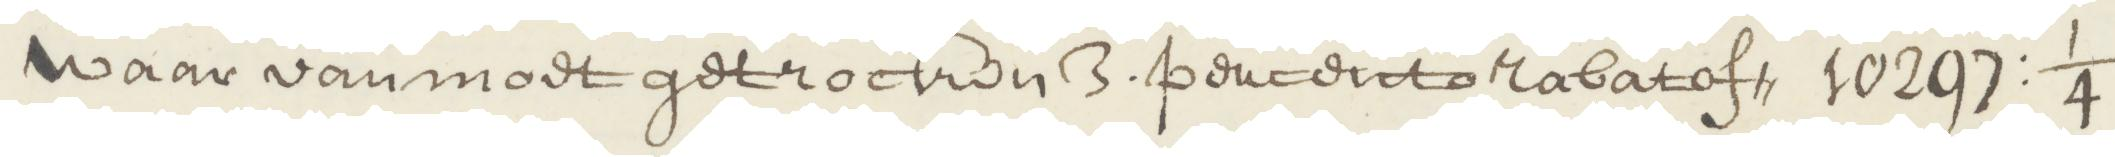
waar van moet getrocken 3. percento rabat of „ 10297: ¼
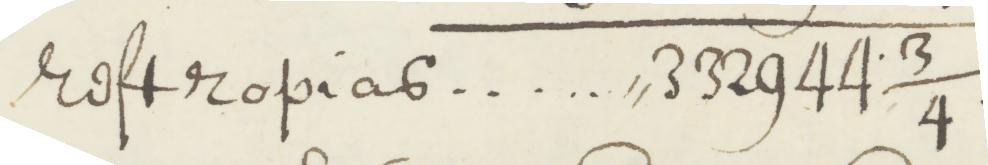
rest ropias . . . . . „ 332944.¾.
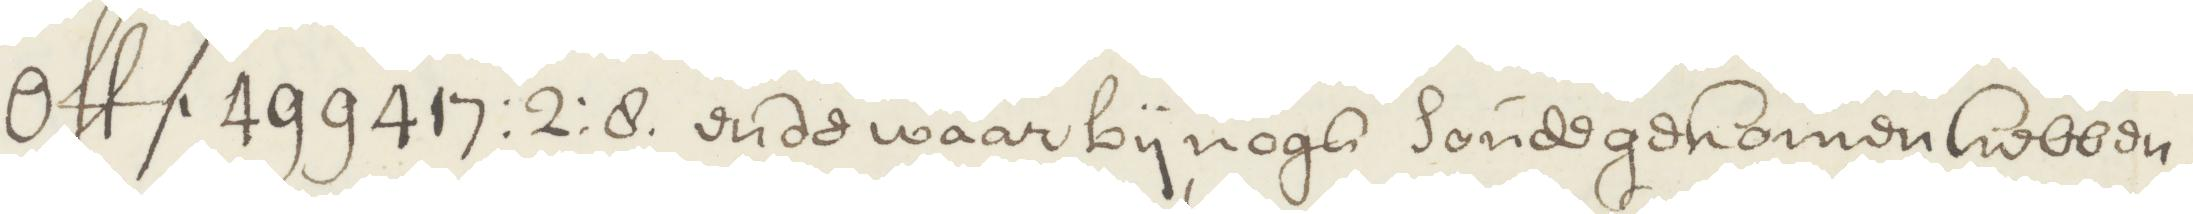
off ƒ499417:2:8. ende waar bij nogh soude gekomen hebben
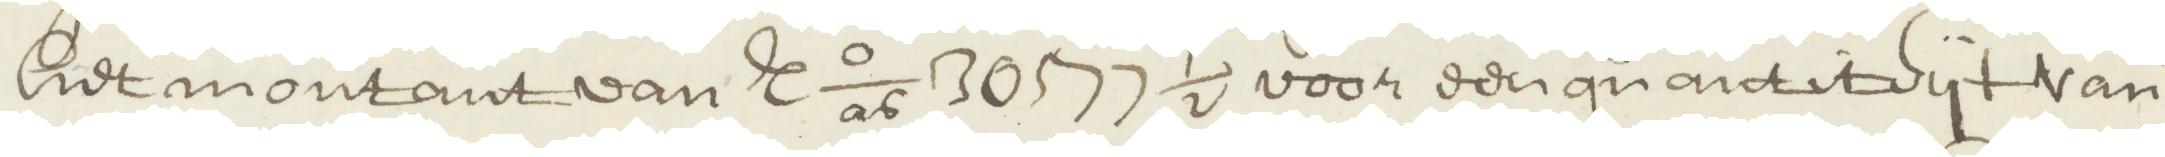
het montant van ro/as 30577½ voor een quantiteijt van
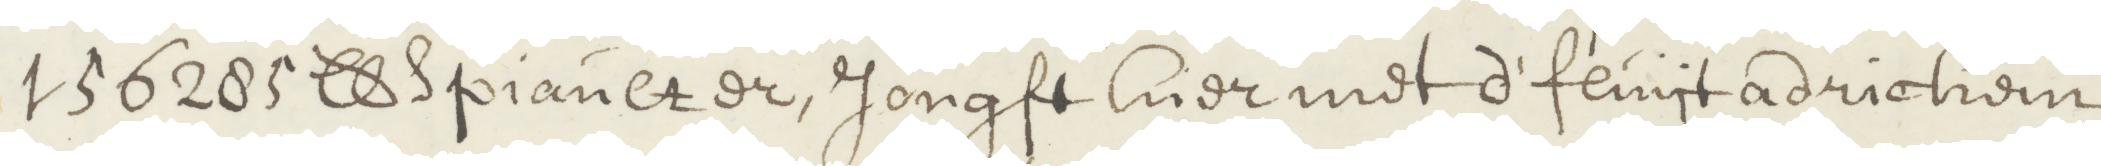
156285 lb spiaulter, Jongst hier met d’ fluijt adrichem
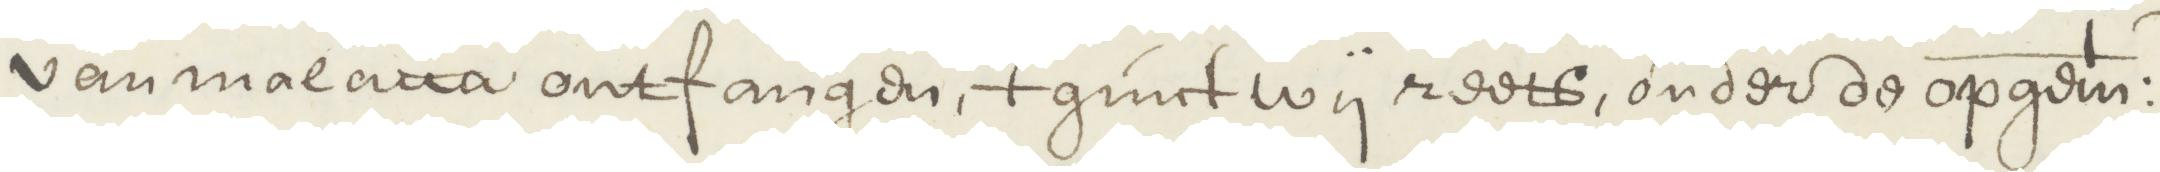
van malacca ontfangen, 't gunt wij reets, onder de opgem:t
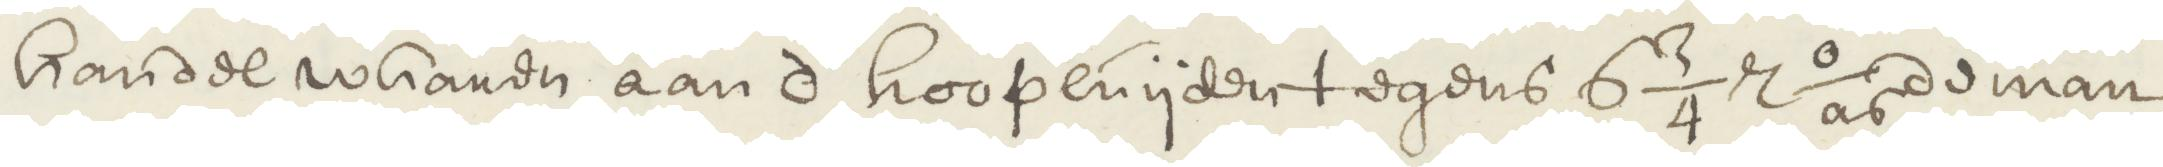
handel wharen aan d' koopluijden tegens 6¾ ro/as de man
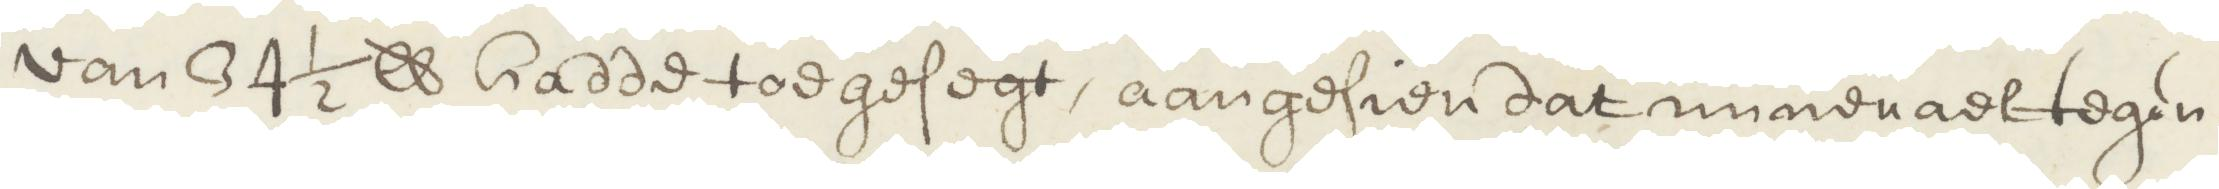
van 34½ lb hadde toegesegt, aangesien dat minerael tegen
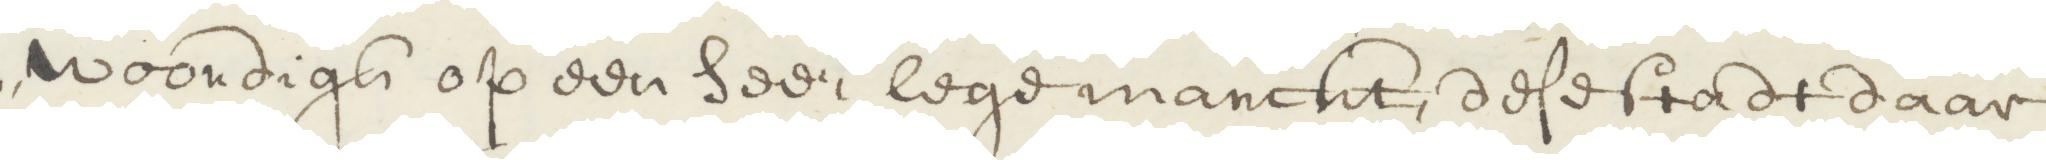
„woordigh op een seer lege manckt; dese stadt daar
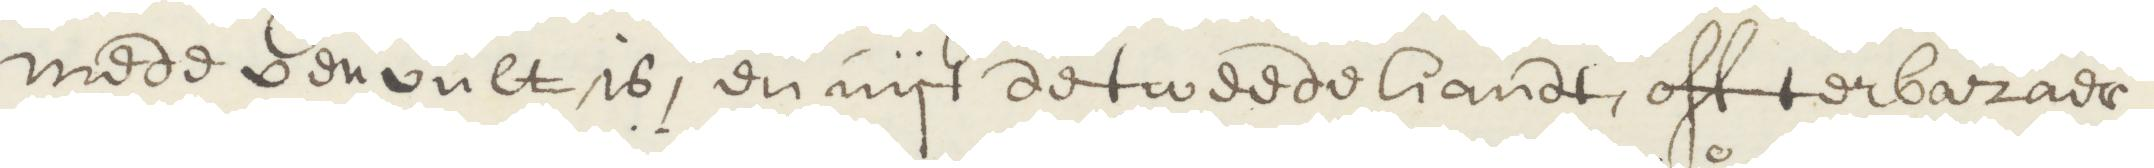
mede vervult is, en uijt de tweede handt, off ter bazaer
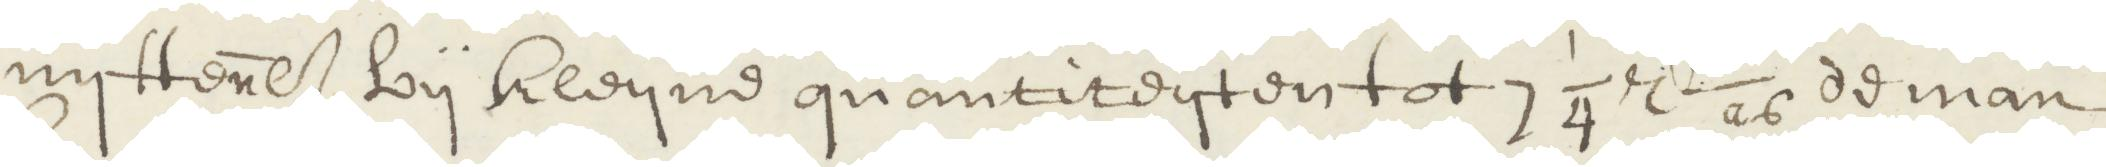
uijtterlijk bij kleijne quantiteijten tot 7¼ ro/as de man
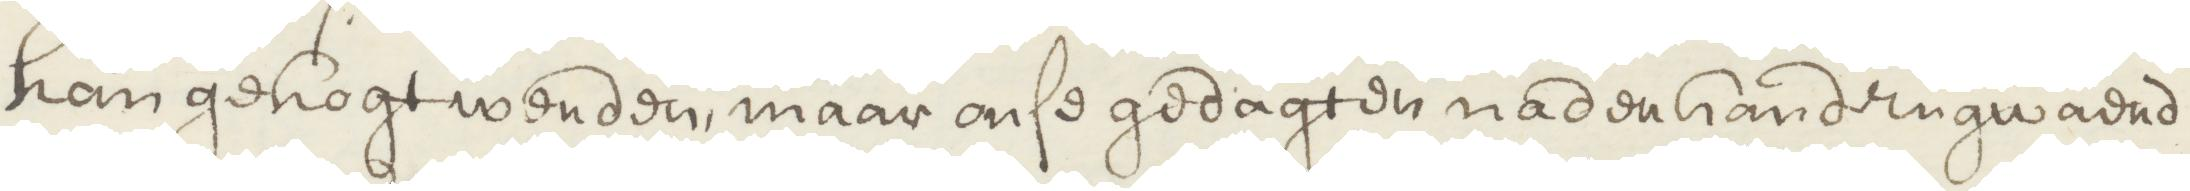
kan gekogt werden, maar onse gedagten naderhand rugwaerd
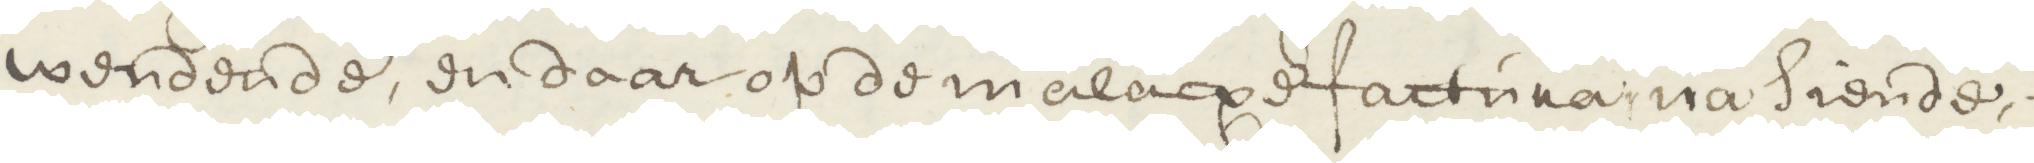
wendende, en daar op de malacxe factura; na siende,
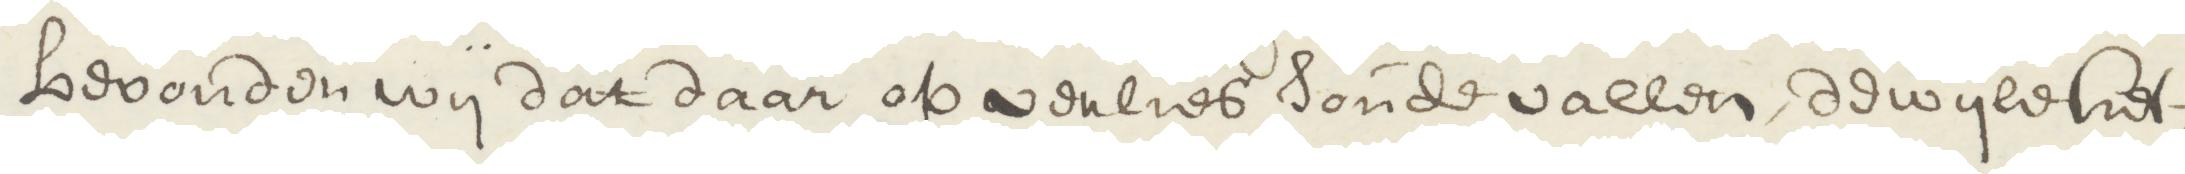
bevonden wij dat daar op verlies soude vallen, de wijle het
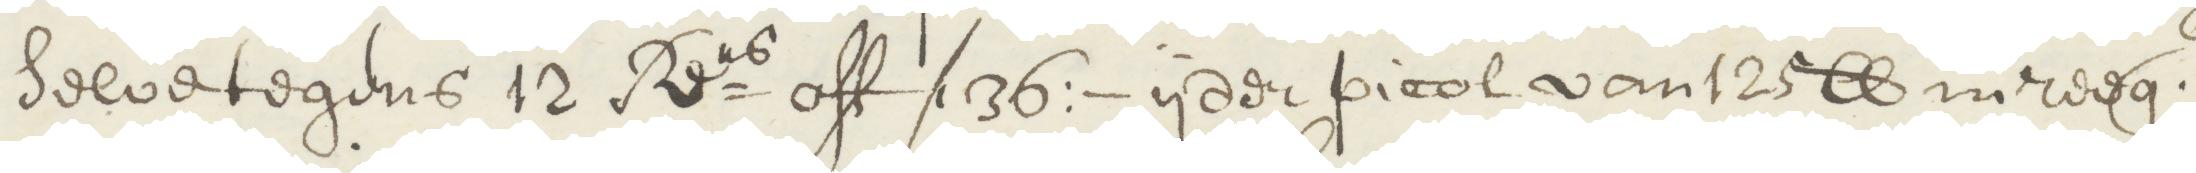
selve tegens 12 Rd=rs off ƒ36: — ijder picol van 125 lb in reeq.
